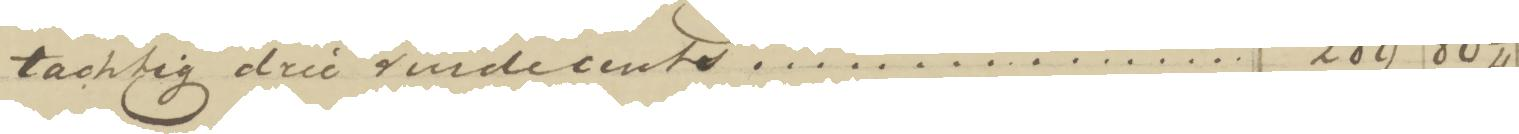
tachtig drie vierde cents . . . . . . . . . . . . . . . . 289 86¾
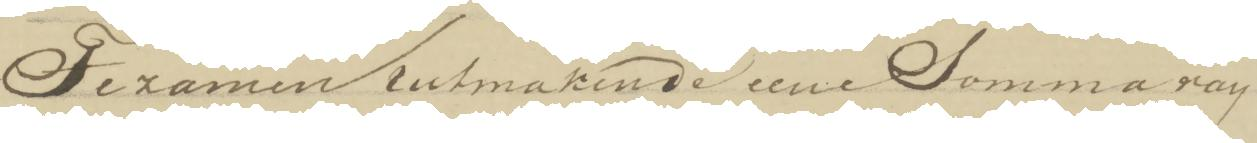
Te zamen uitmakende eene Somma van
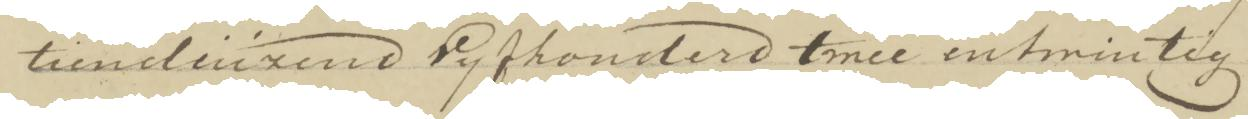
tienduizend vijfhonderd twee en twintig
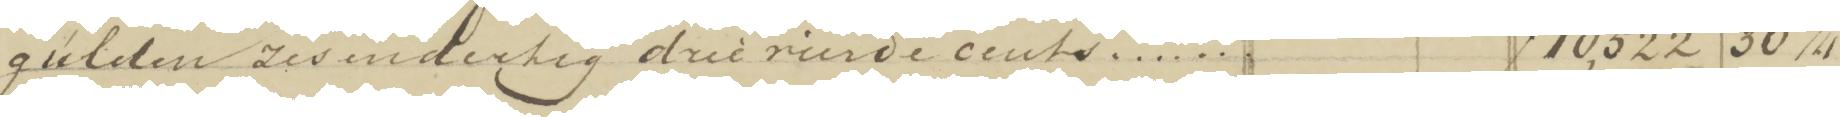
gulden zesendertig drie vierde cents . . . . . . ƒ 10,522 36¾
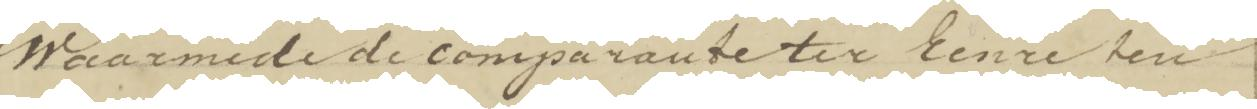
Waarmede de comparante ter Eenre ten
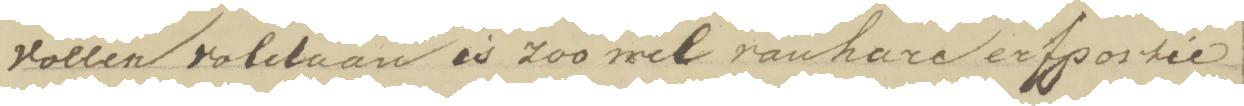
vollen voldaan is zoo wel van hare erfportie
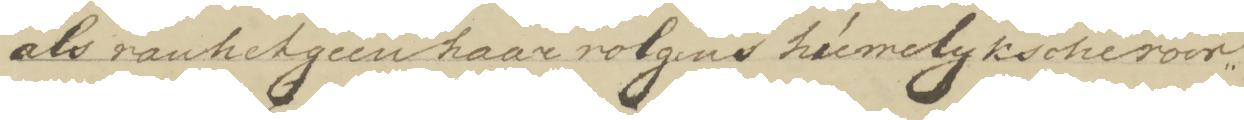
als van het geen haar volgens huwelyksche voor„
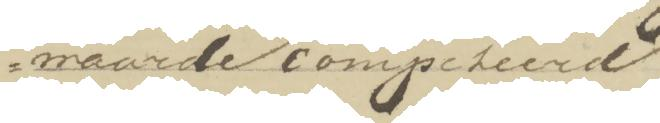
„waarde competeerd
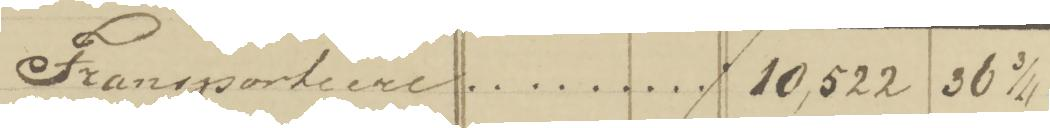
Transporteere . . . . . . . . . ƒ 10,522 36¾
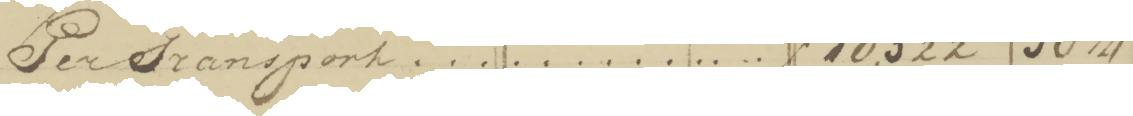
Per Transport. . . . . . . . . . . . .ƒ 10,522 36¾
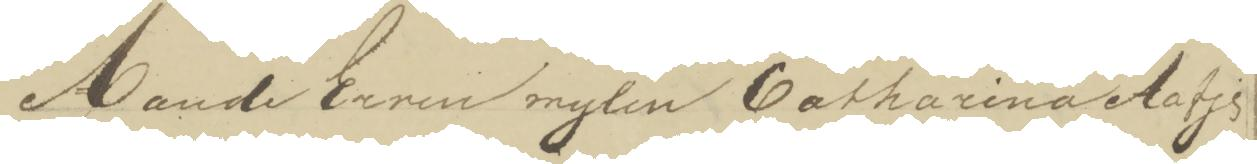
Aande Erven wylen Catharina Aafje
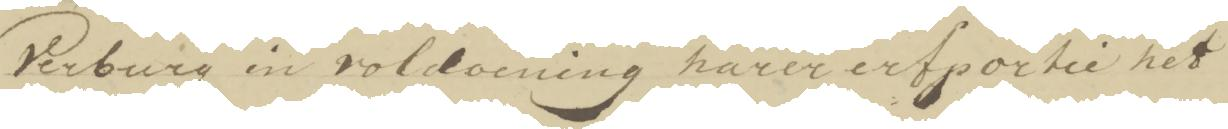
Verburg in voldoening harer erfportie het
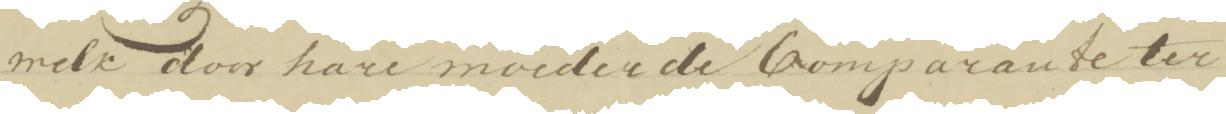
welk door hare moeder de Comparante ter
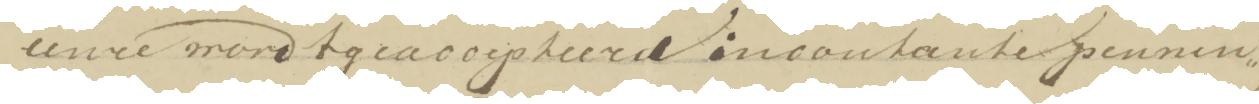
eenre wordt geaccepteerd in contante pennin„
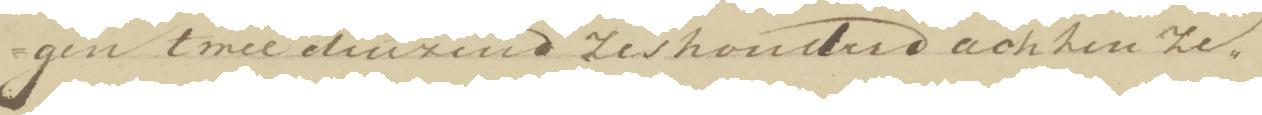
„gen twee duizend zes honderd acht en ze„
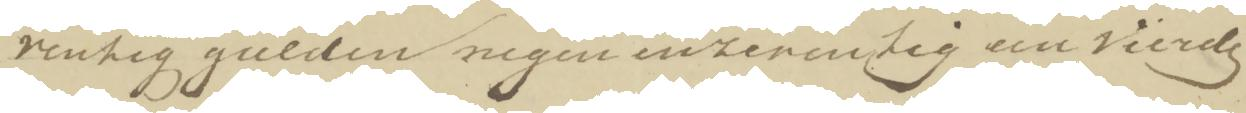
ventig gulden negen en zeventig een vierden
